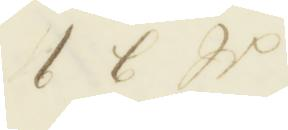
M C W
